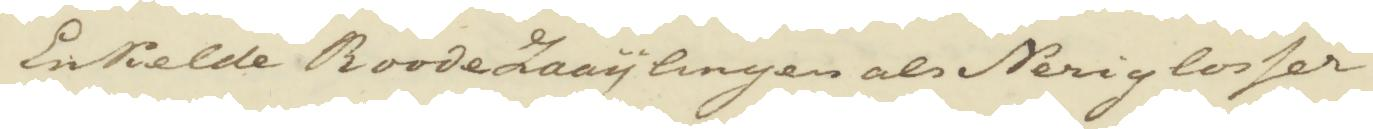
Enkelde Roode Zaaijlingen als Neriglosser
